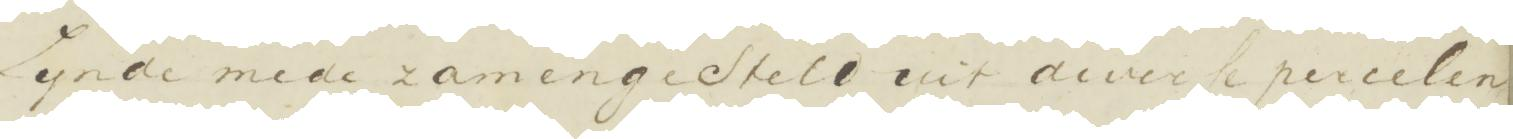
Zynde mede zamengesteld uit diverse percelen
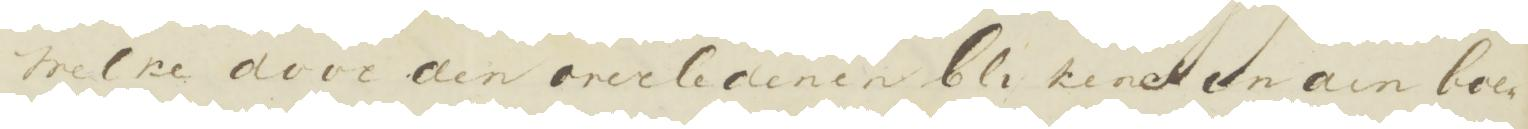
welke door den overledenen blykens in den boe„
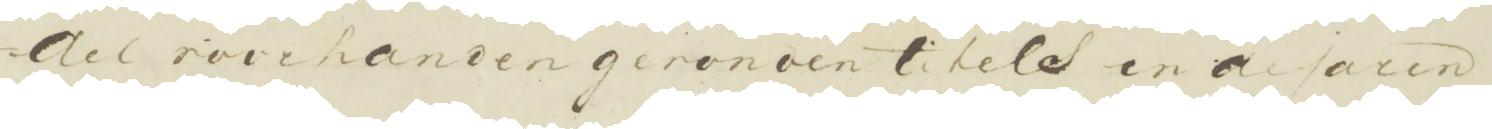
=del voorhanden gevonden titels in de jaren
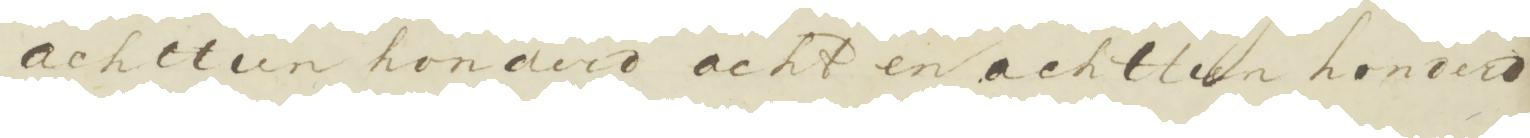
achttien honderd acht en achttien honderd
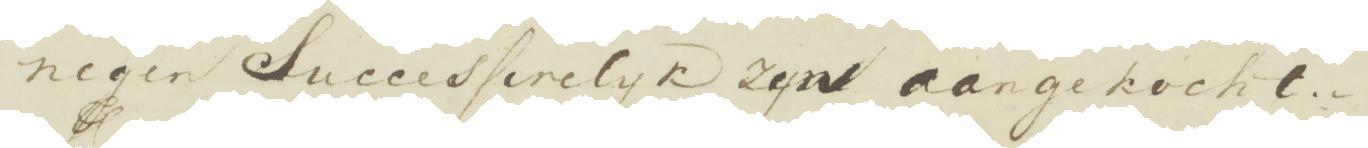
negen successivelyk zyn aangekocht.
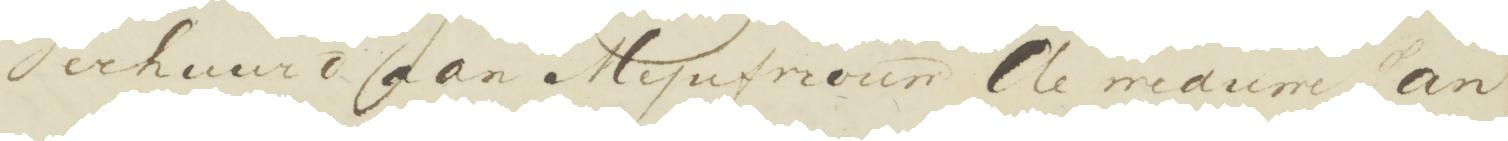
Verhuurd aan Mejufvrouw de weduwe Jan
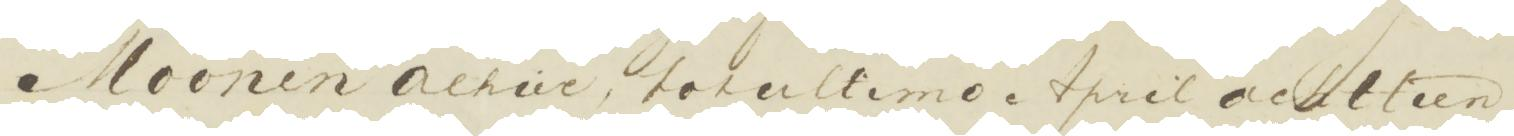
Moonen alhier, tot ultimo April achttien
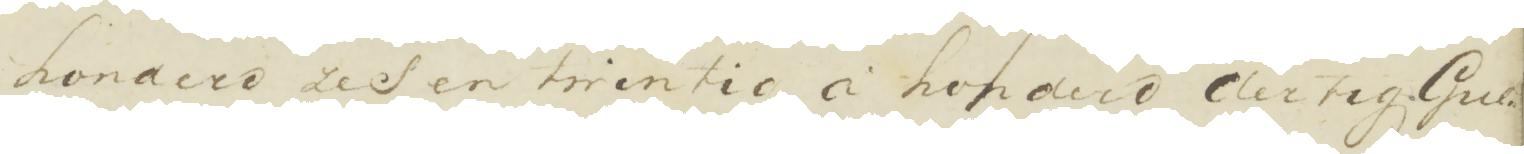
honderd zes en twintig a honderd dertig Gul„
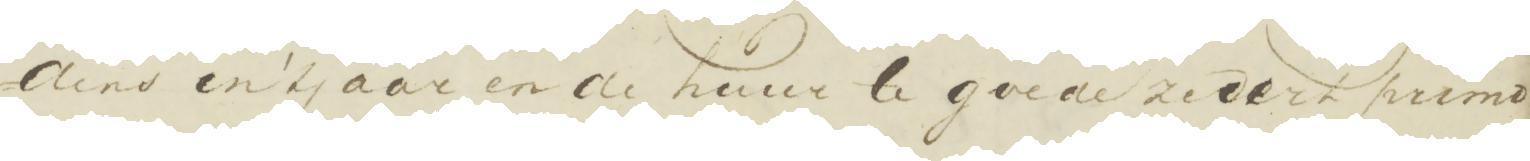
=dens in't jaar, en de huur te goede zedert primo
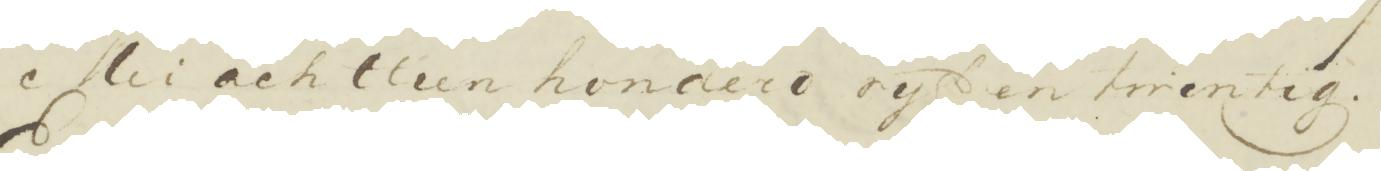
Mei achttien honderd vyf en twintig.
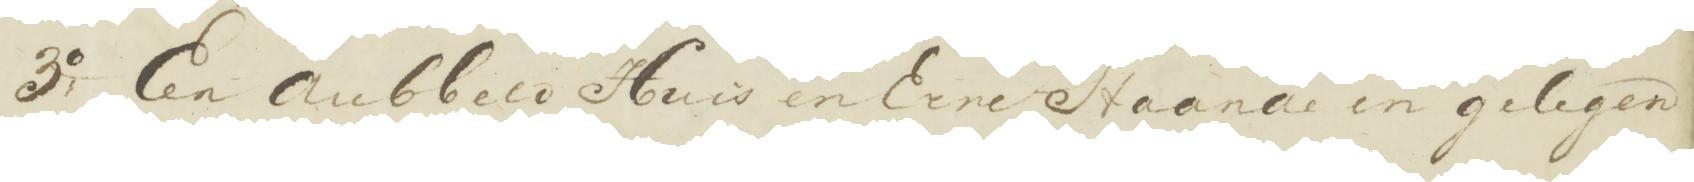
3:o Een dubbeld Huis en Erve staande en gelegen
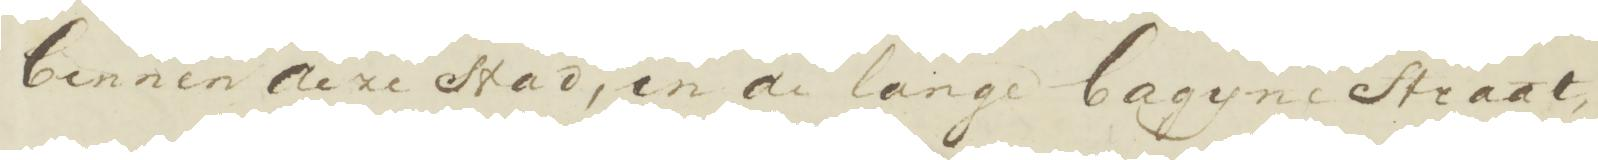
binnen deze stad, in de lange bagyne straat,
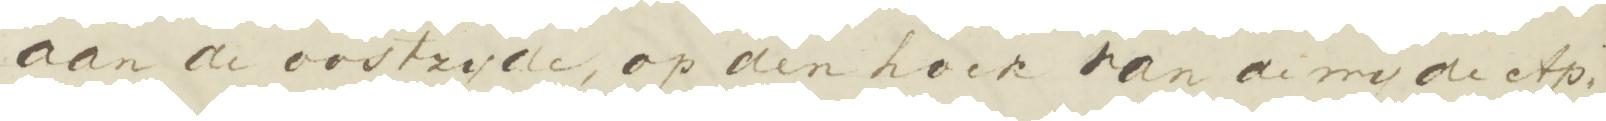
aan de oostzyde, op den hoek van de wyde Ap„
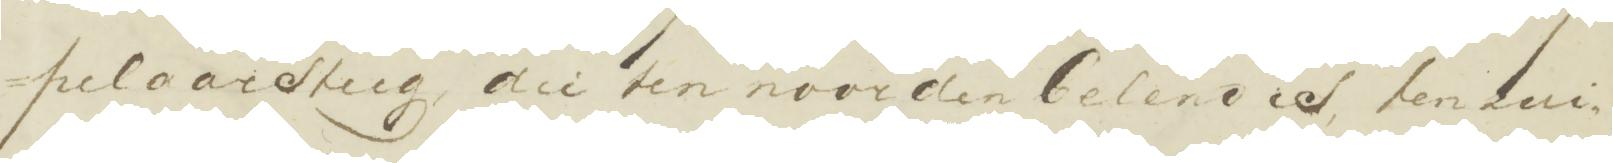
=pelaarsteeg, die ten noorden belend is, ten zui„
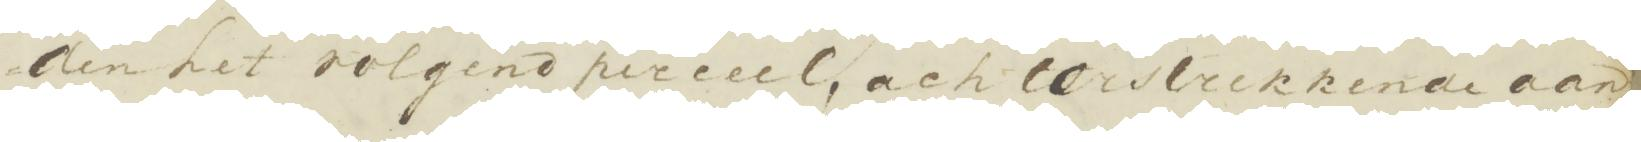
=den het volgend perceel, achterstrekkende aan
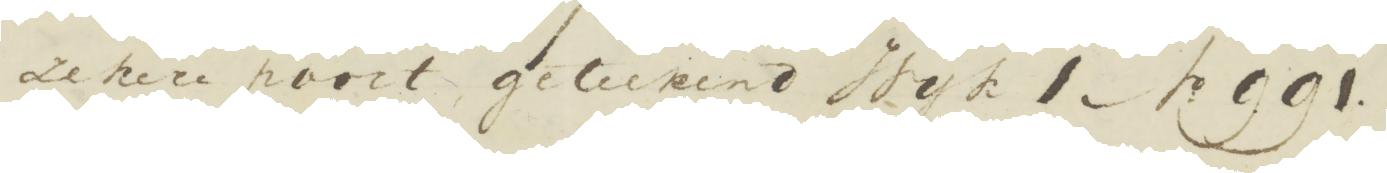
zekere poort geteekend Wyk 1 N:o 991.
